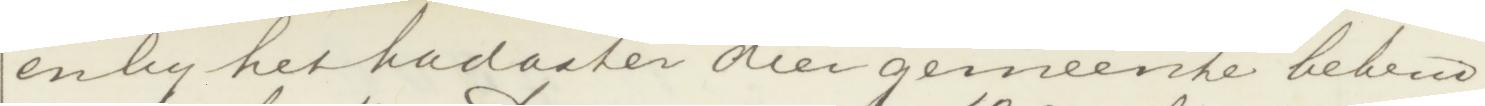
en by het kadaster dier gemeente bekend
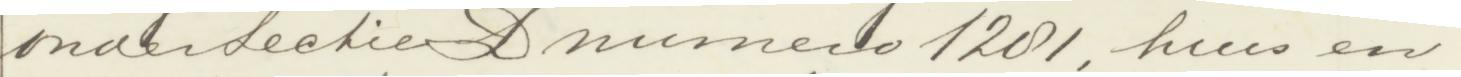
onder sectie D numero 1281 huis en
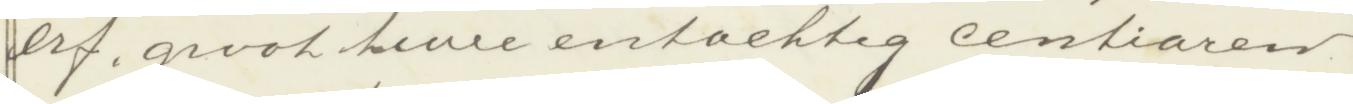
erf, groot twee entachtig centiaren.
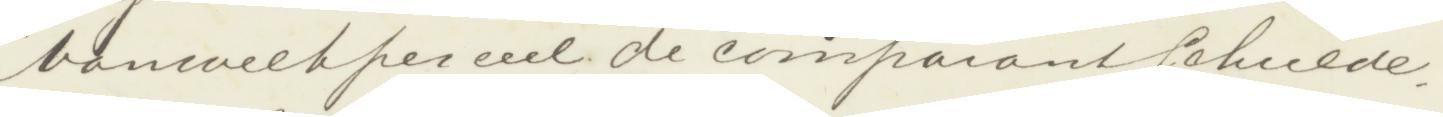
van welk perceel de comparant schulde,
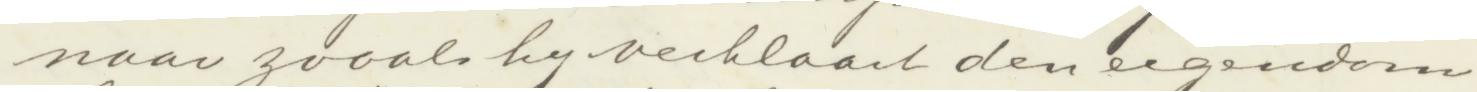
naar zooals hy verklaart den eigendom
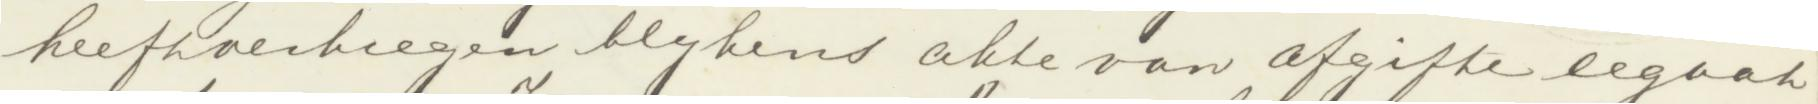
heeft verkreegen blykens akte van afgifte legaat
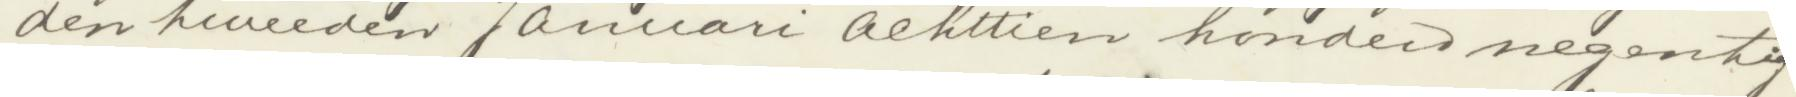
den tweeden Januari achttien honderd negentig
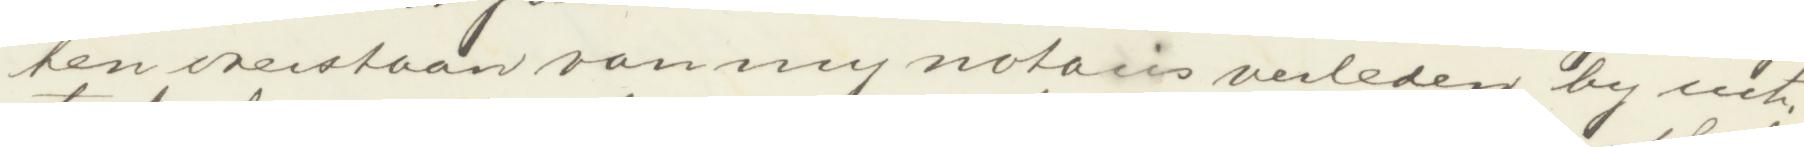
ten overstaan van my notaris verleden, by uit,
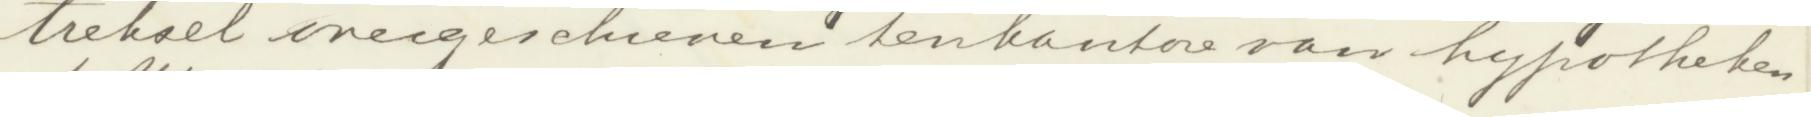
treksel overgeschreven ten kantore van hypotheken
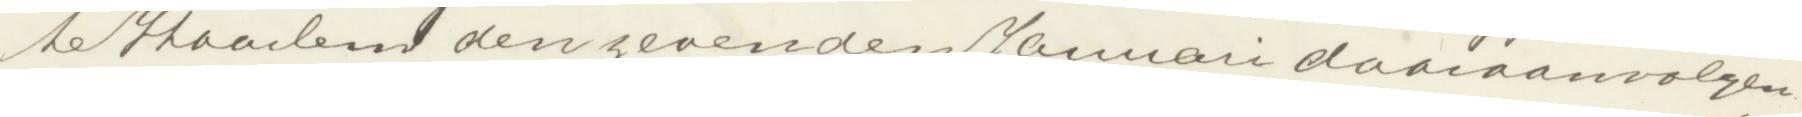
te Haarlem den zevenden Januari daaraanvolgen
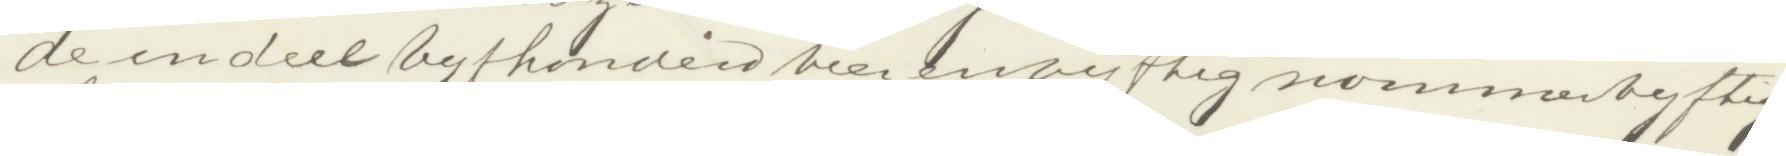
de in deel vyfhonderd vier en vyftig nommer vyftig
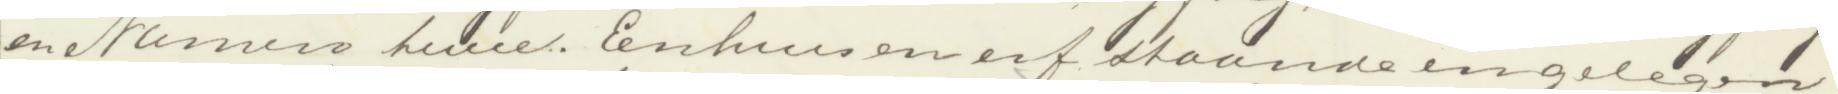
en Numero twee. Een huis en erf staande en gelegen
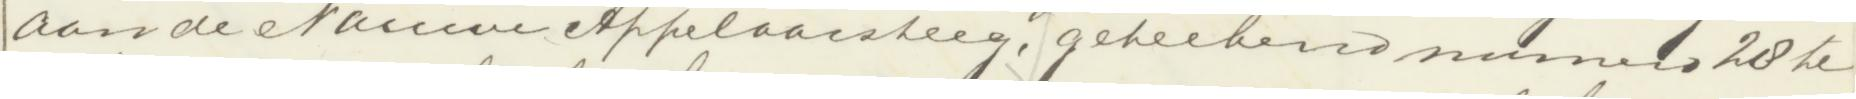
aan de Nauwe Appelaarsteeg,] geteekend numero 28 te
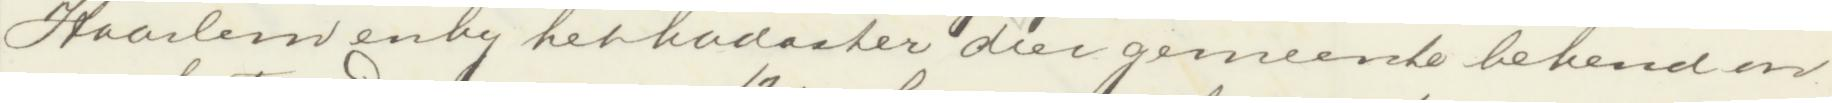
Haarlem en by het kadaster dier gemeente bekend on
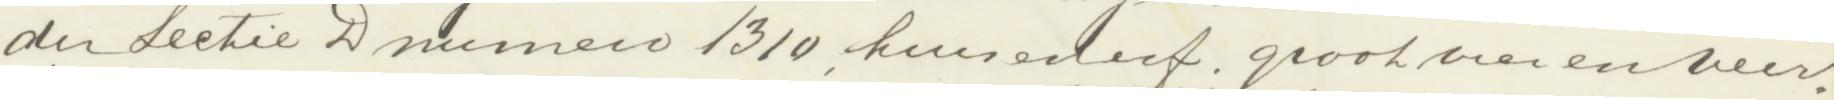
der sectie D numero 1310, huis en erf, groot vier en veer„
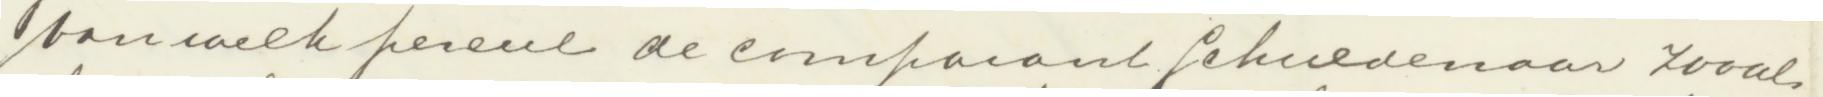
Van welk perceel de comparant schuldenaar zooals
